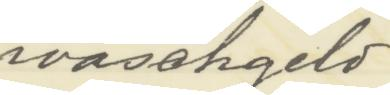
waschgeld
